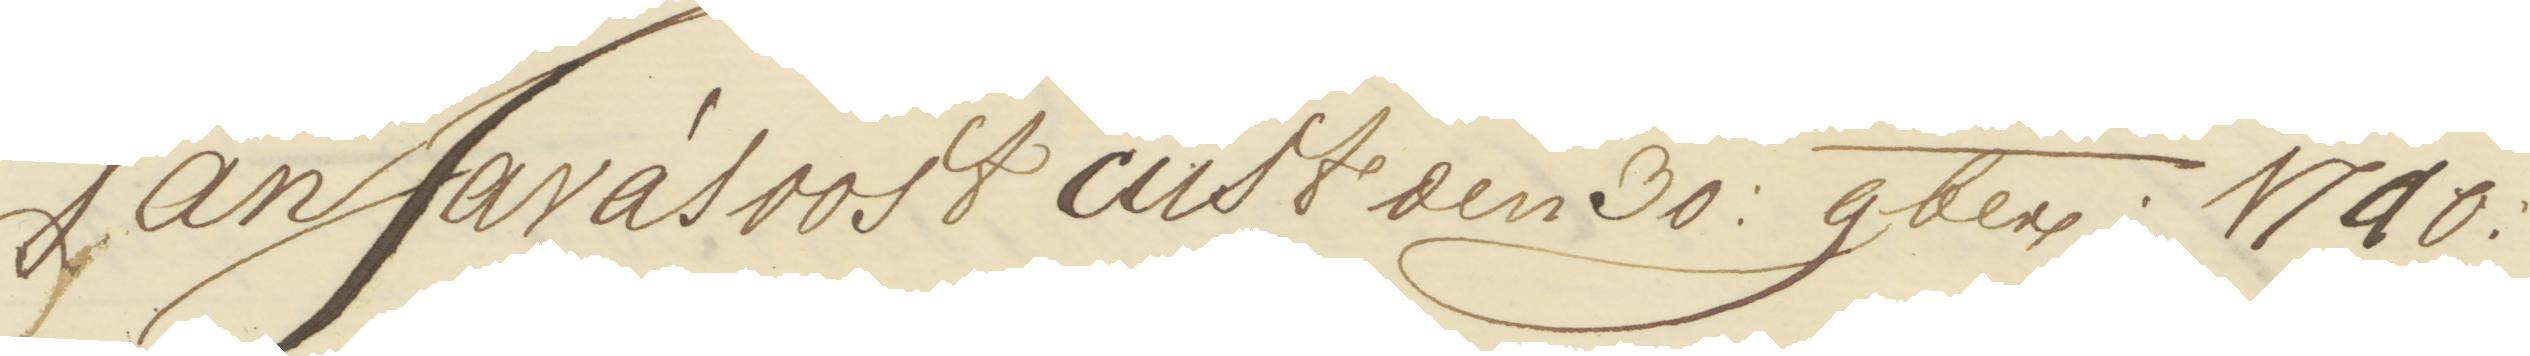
Van Java's oost cust den 30: 9ber: 1740:
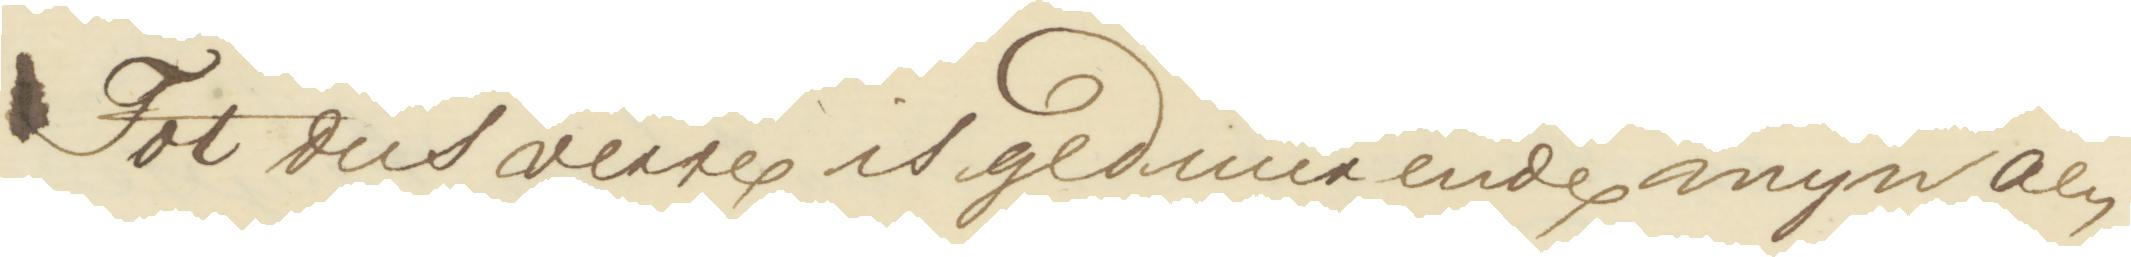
Tot dus verre is geduurende mijn aen
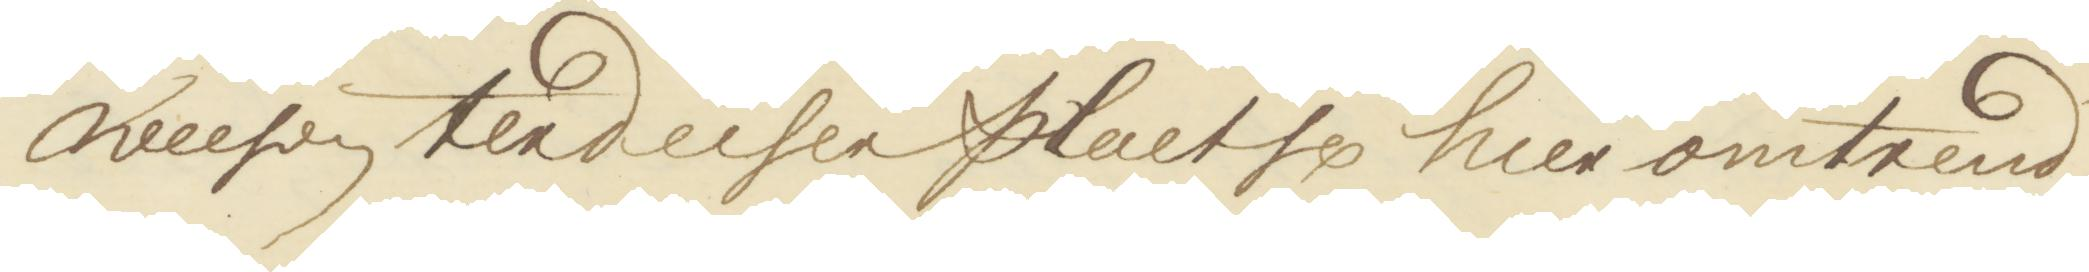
weesen ter deeser plaetse hier omtrend
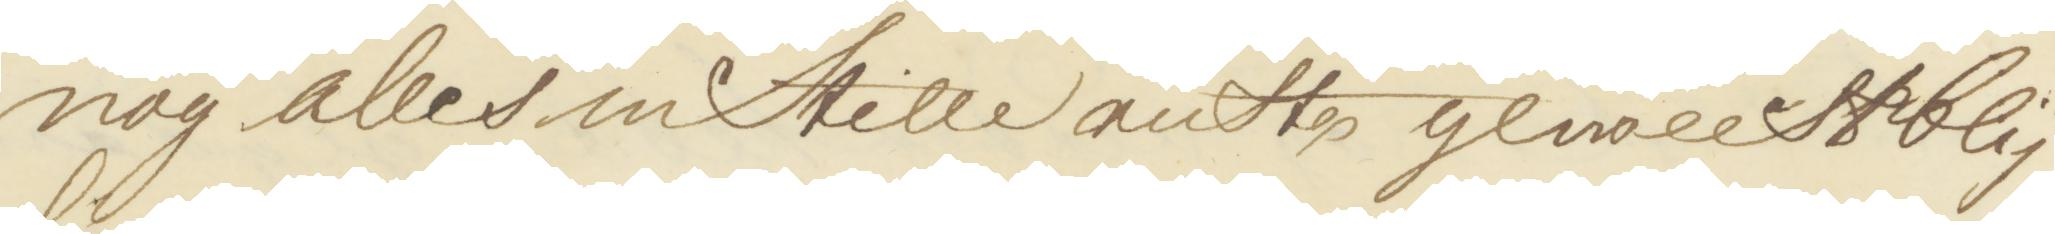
nog alles in stille ruste geweest blij
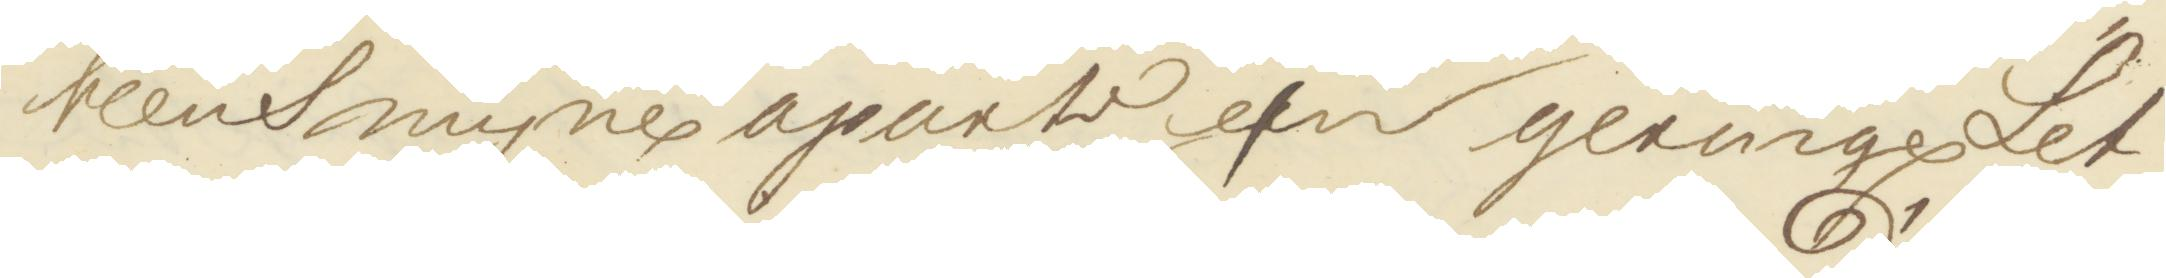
kens mijne aparte en geringe Let
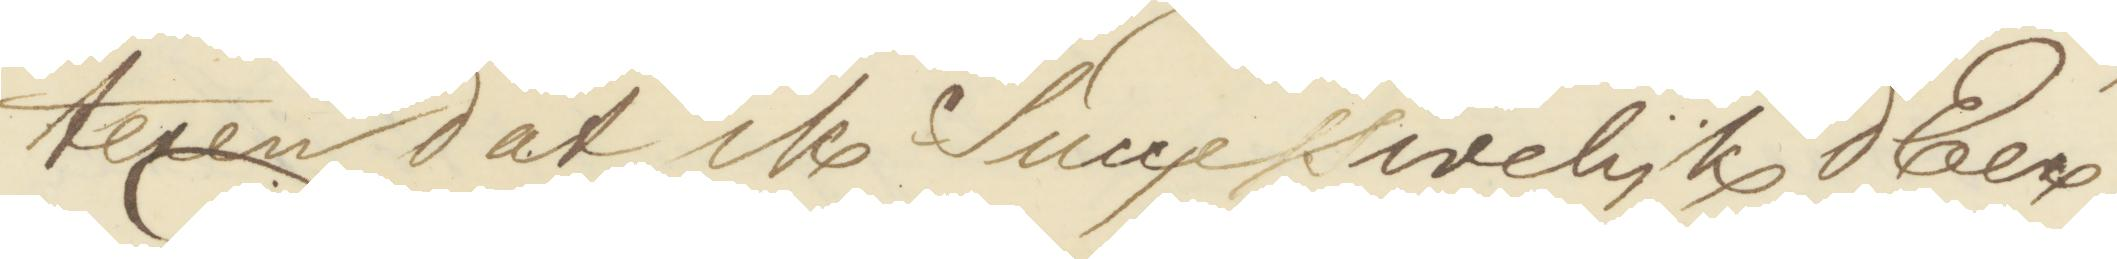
teren dat ik successivelijk d' Eer
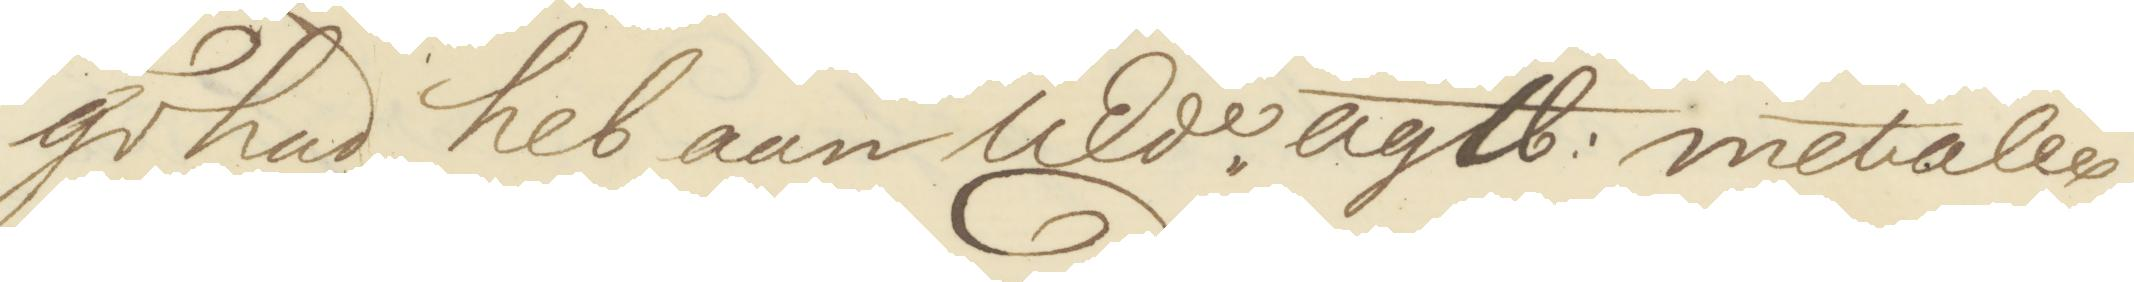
gehad heb aan uEd„e agtb: met alle
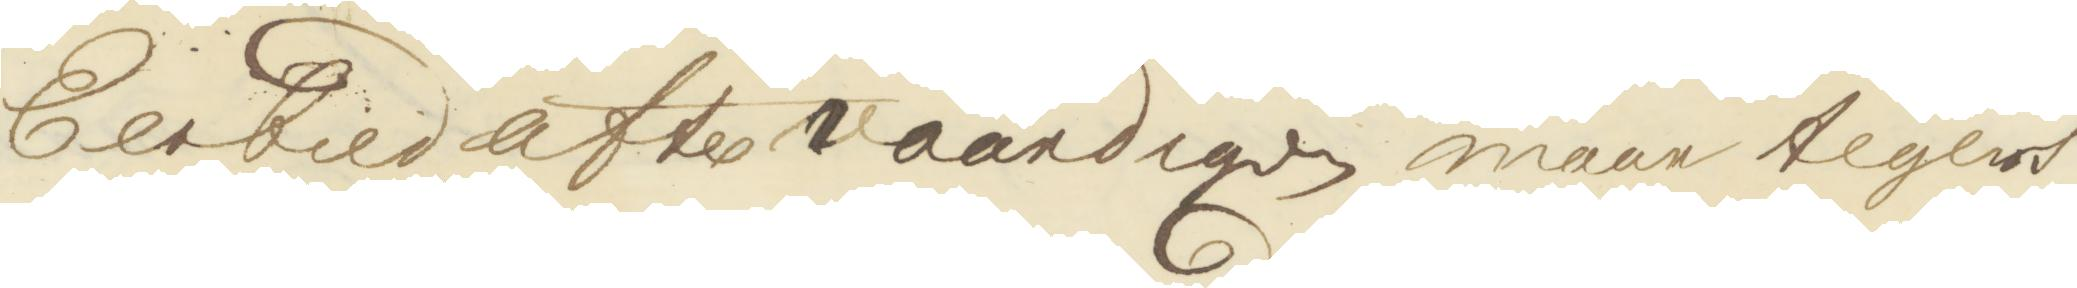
Eerbied af te vaardigen maar tegens
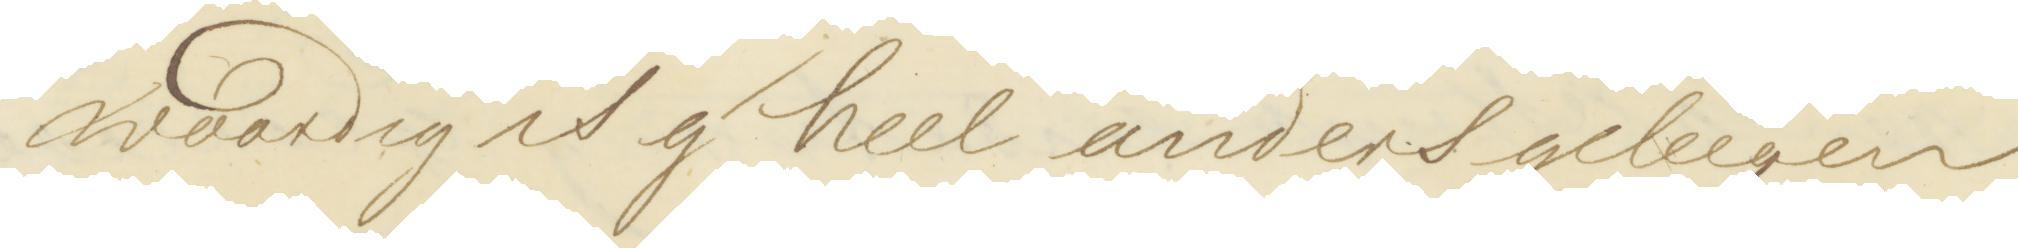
woordig is g' heel anders geleegen
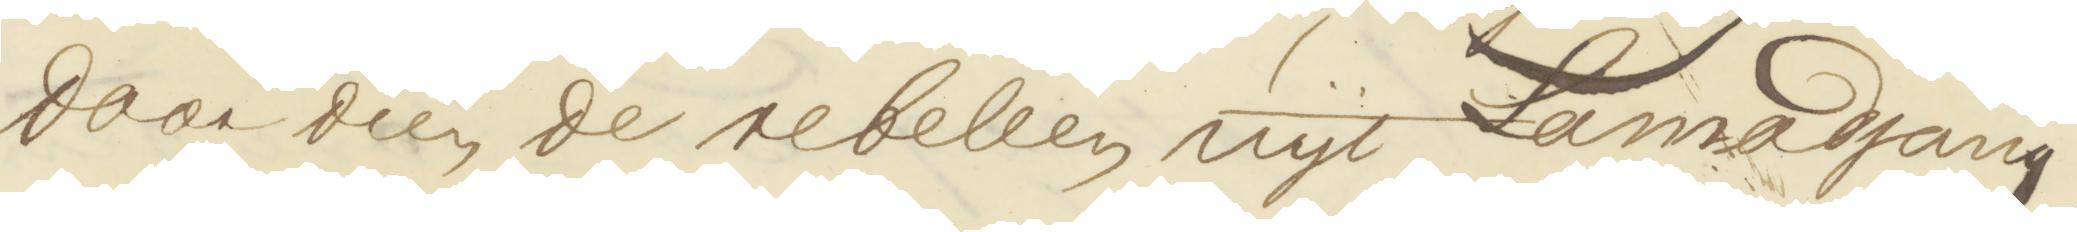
door dien de rebellen uijt Lamadjang
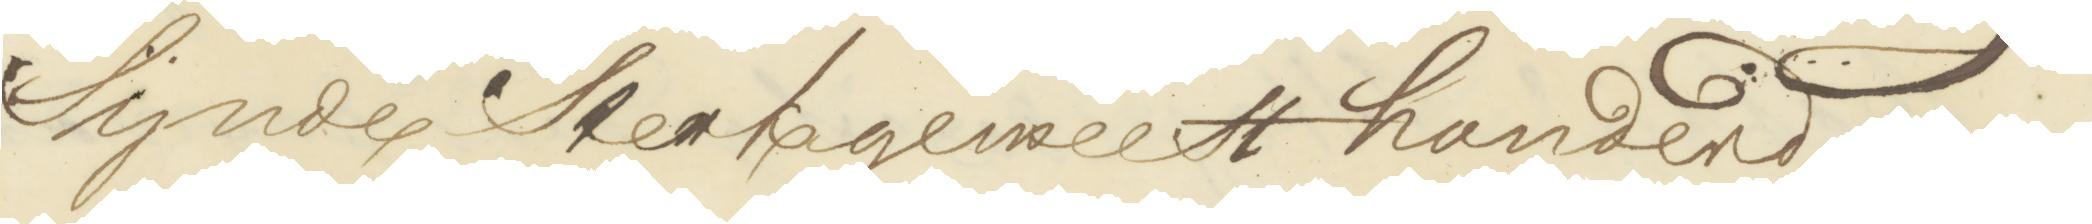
sijnde sterk geweest honderd man
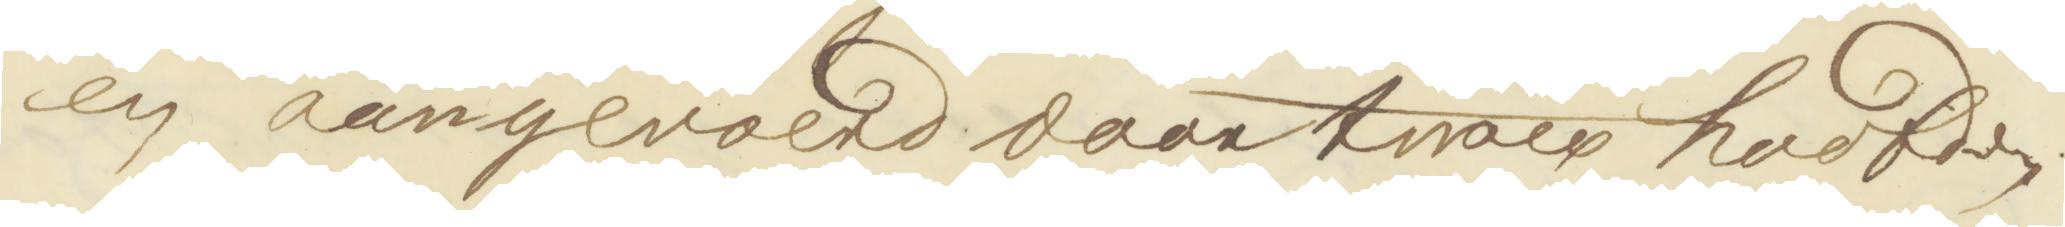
en aangevoerd door twee hoofden
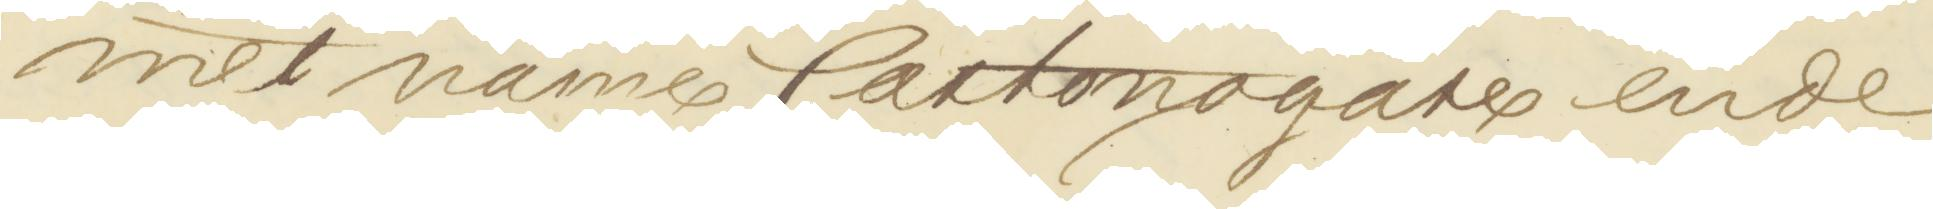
met name Cartonogate ende
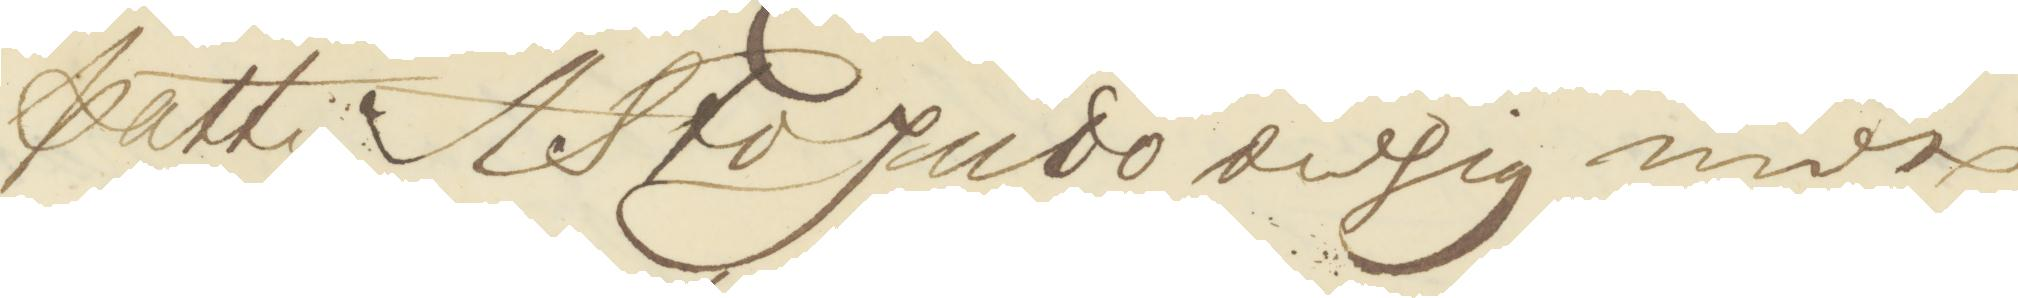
pattij Asto Jndo diesig niet
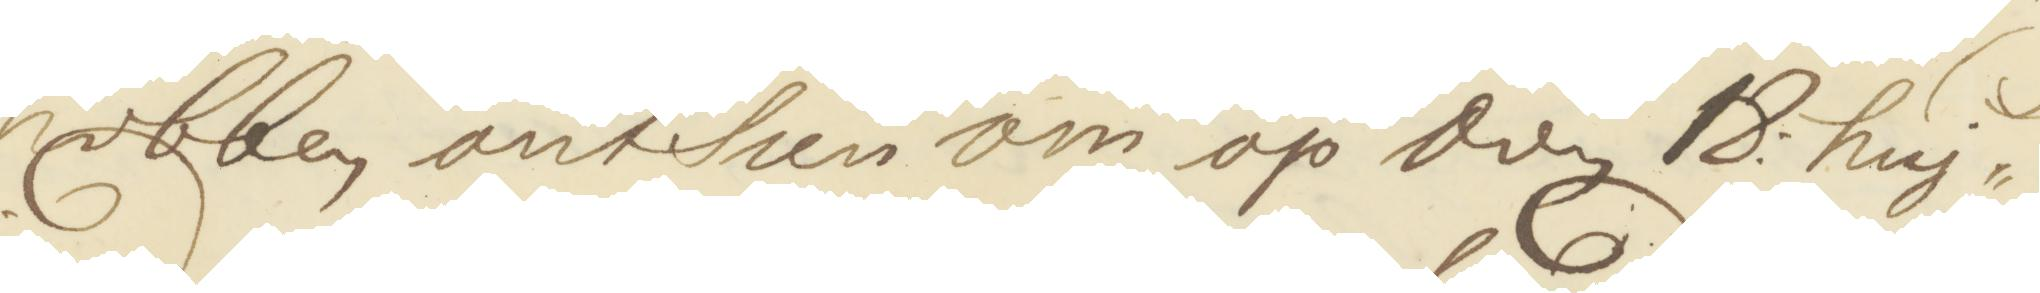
hebben ontsien om op den 18: huij„s
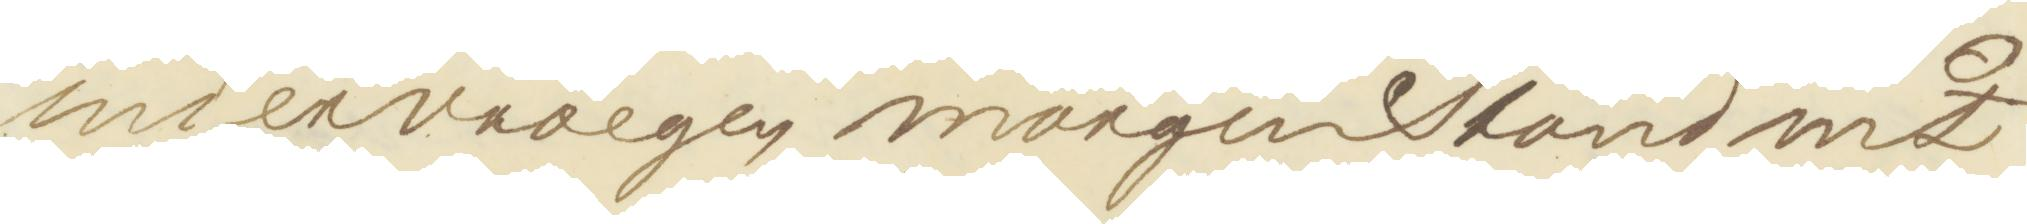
indenvroegen morgenstond int
